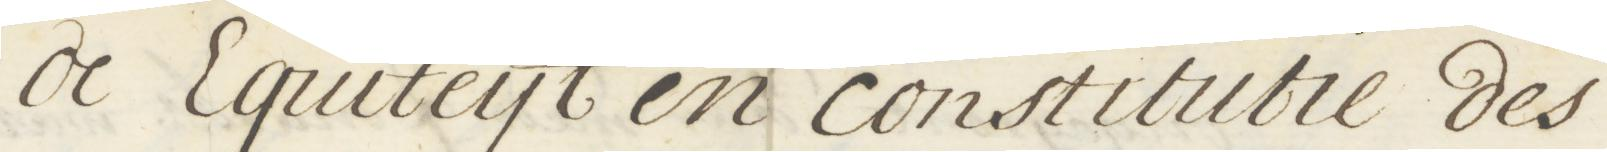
de Equiteijt en constitutie des
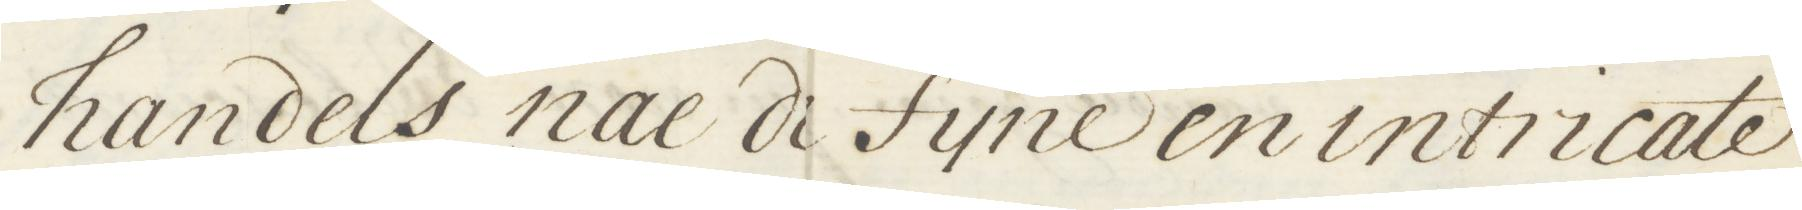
handels nae de fijne en intricate
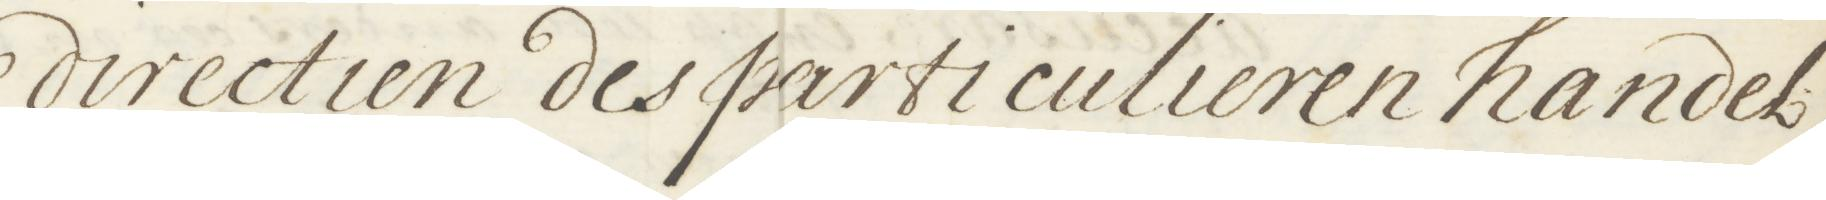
directien des particulieren handel
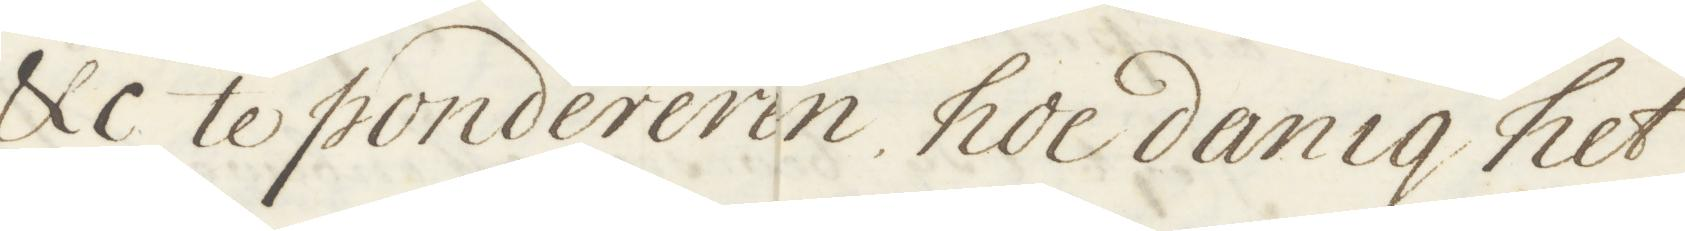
&c te pondereren, hoedanig het
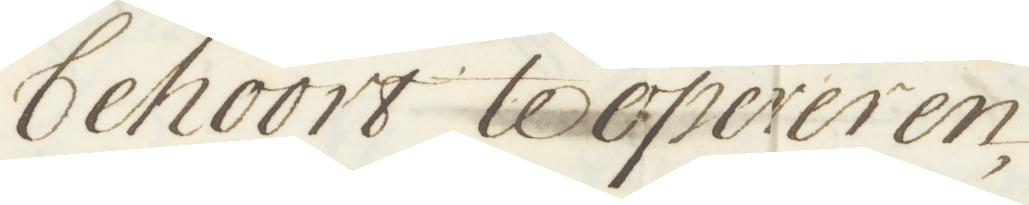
behoort te opereren,
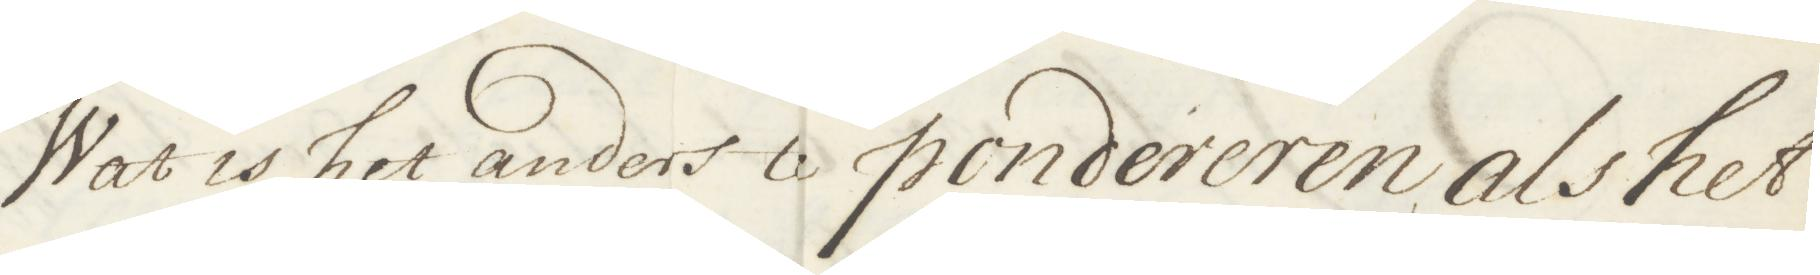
Wat is het anders te pondereren, als het
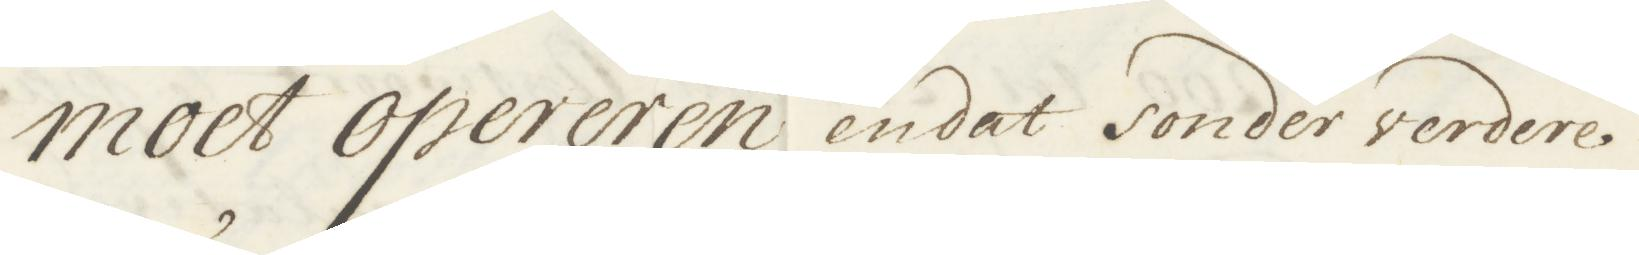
moet opereren en dat sonder verdere
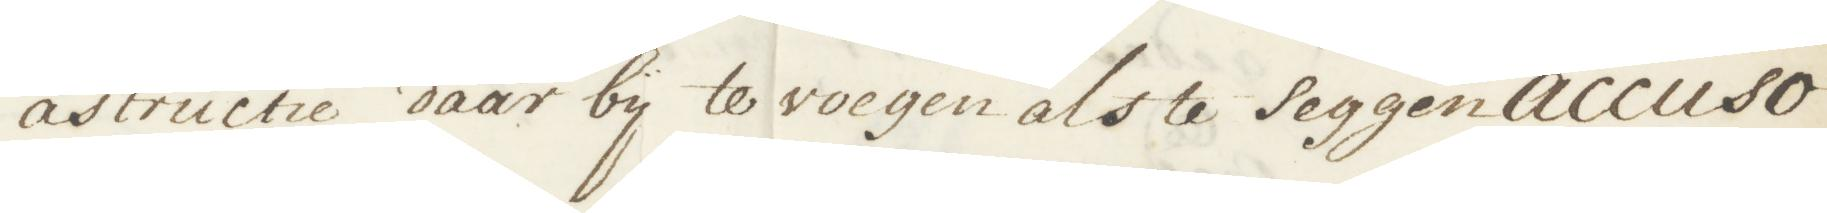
astructie daar bij te voegen als te seggen accuso
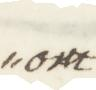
„ort
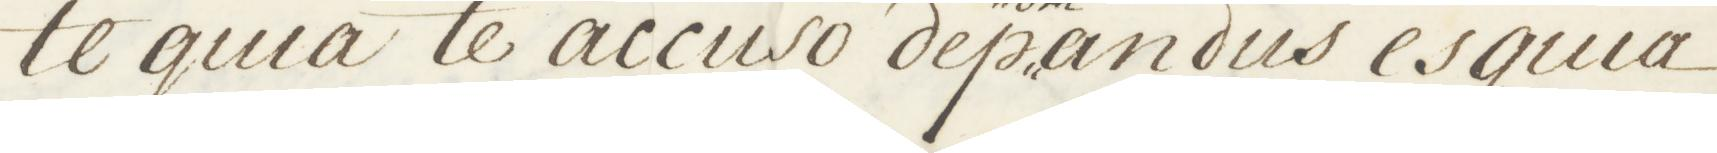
te quia te accuso dep„andus esquia
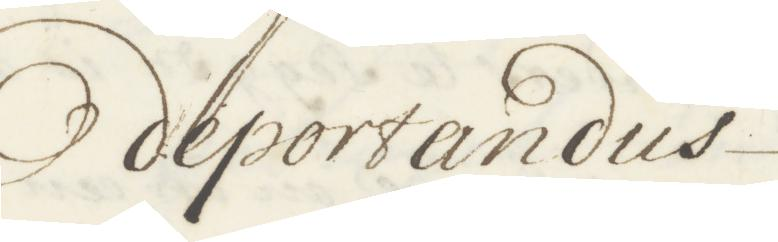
deportandus
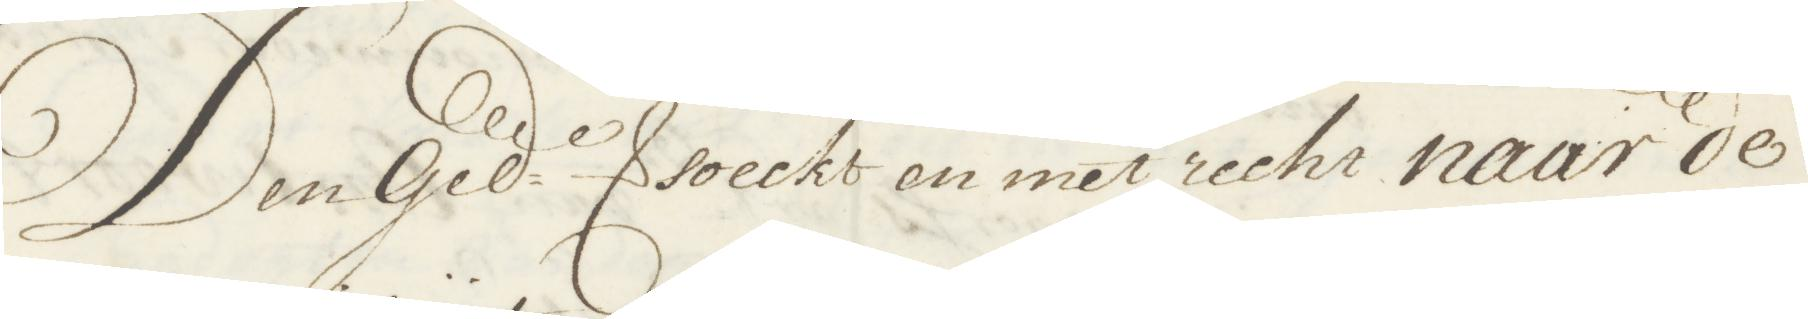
Den Ged=e versoeckt en met recht naar de
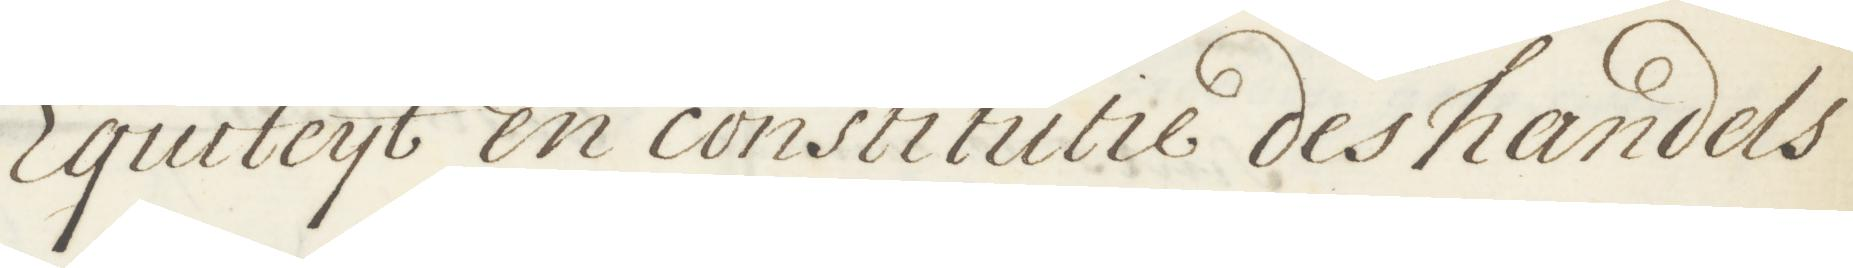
Equiteijt en constitutie des handels
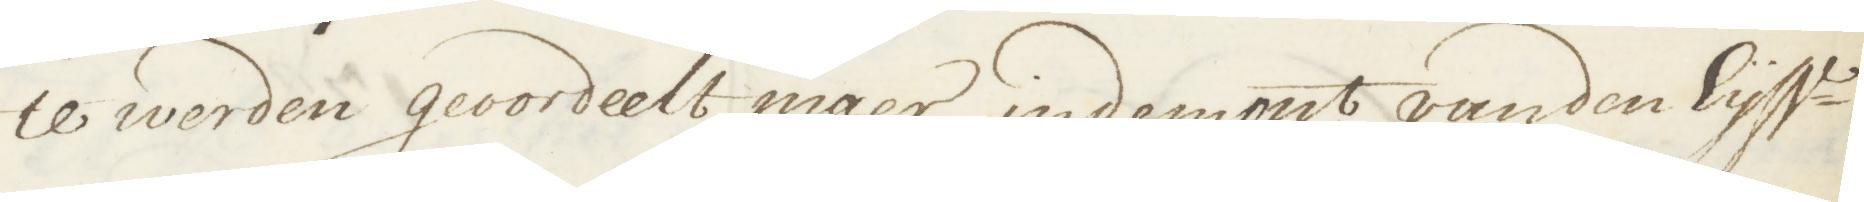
te werden geoordeelt, maer in de mont van den Eijss=r
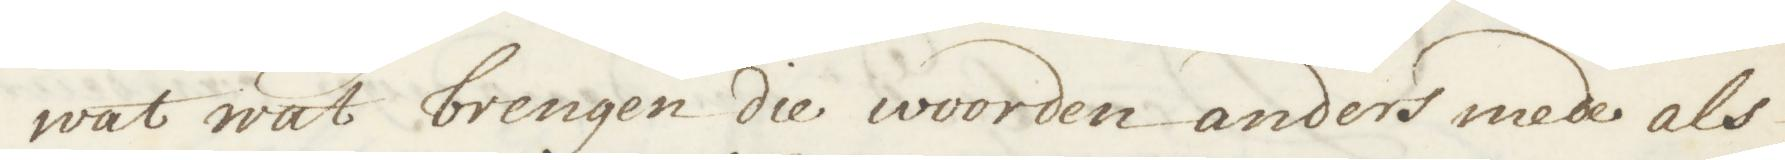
wat wat brengen die woorden anders mede als
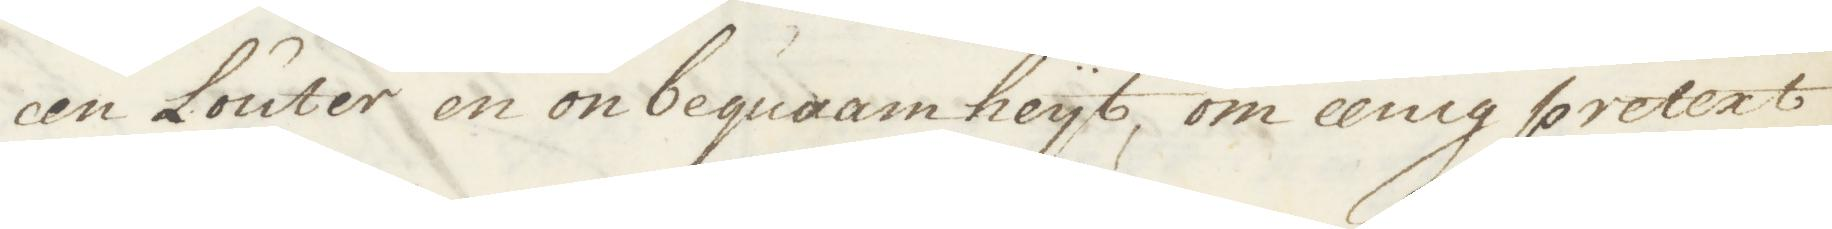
een Louter en onbequaamheijt, om eenig pretext
